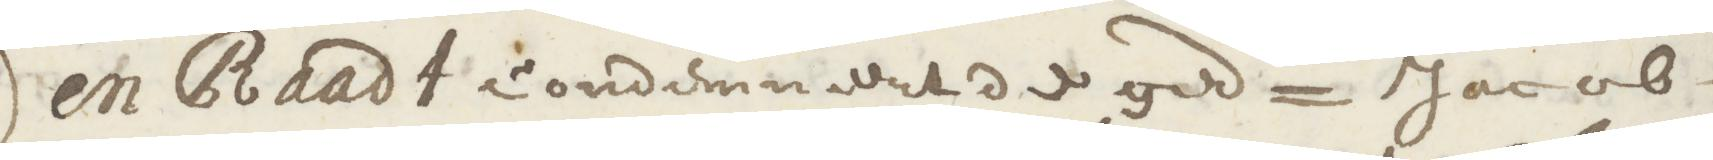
Den Raadt condemneert de ged=e Jacob —
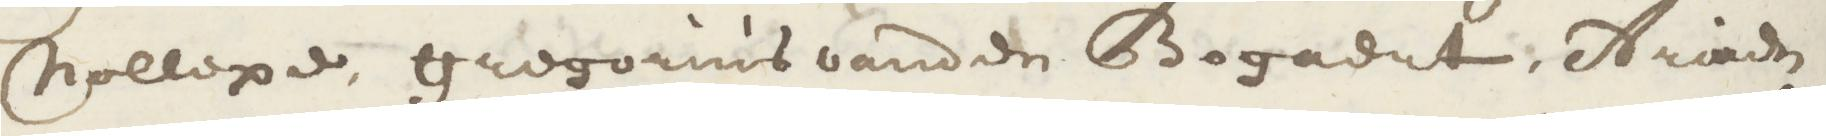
Nollepe, gregorius vanden Bogaert; Ariaen
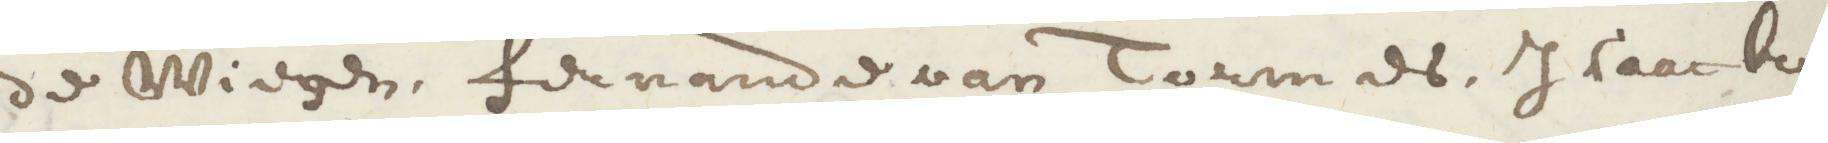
de Wiegen, fernande van Termes, Jsaack
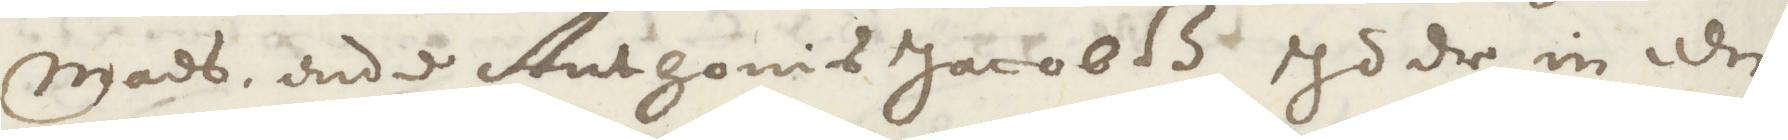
maes, ende Anthonis Jacobs Jder in een
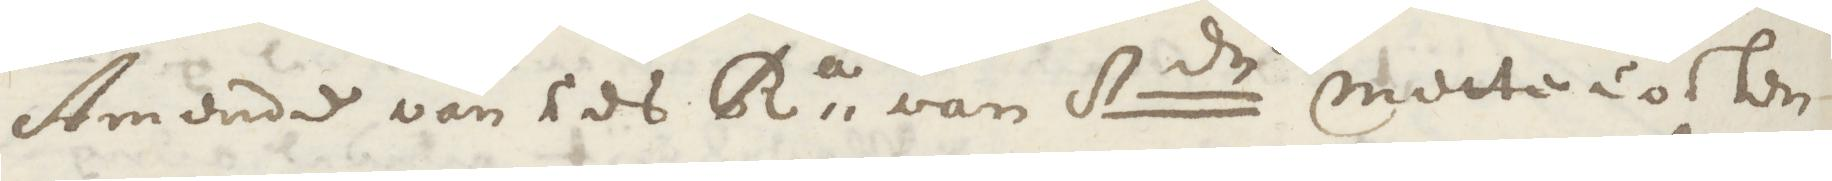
Amende van ses: R„a van 8=en mette costen
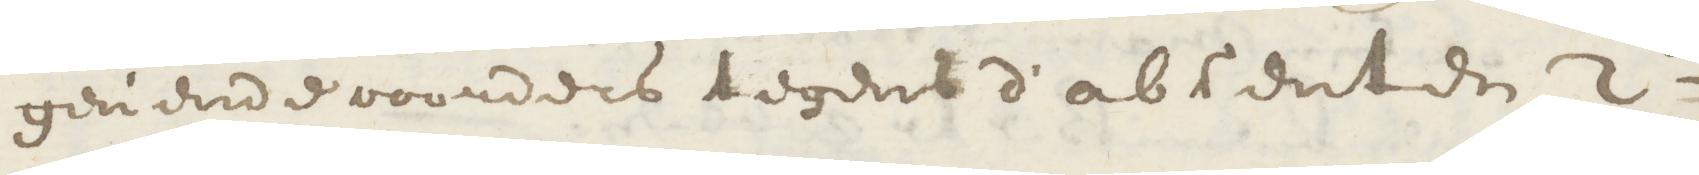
gevende voorders tegens d’ absenten 2=en
